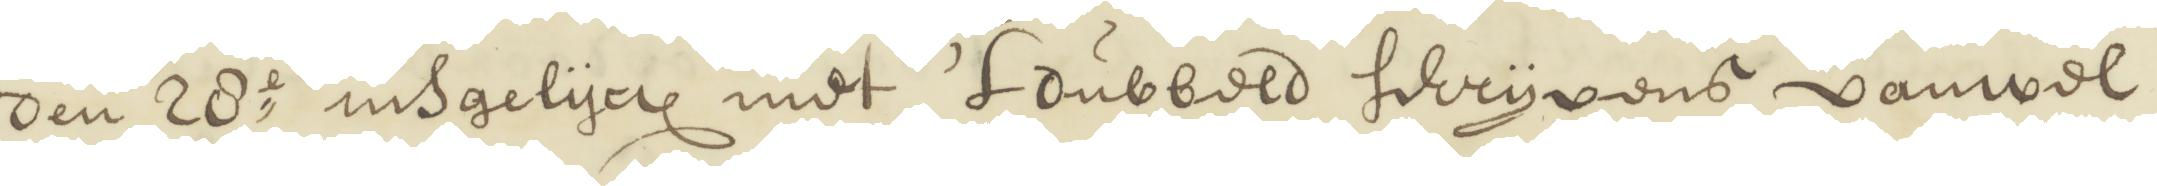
den 28„e insgelijcx met ’t dubbeld schrijvens vanwel
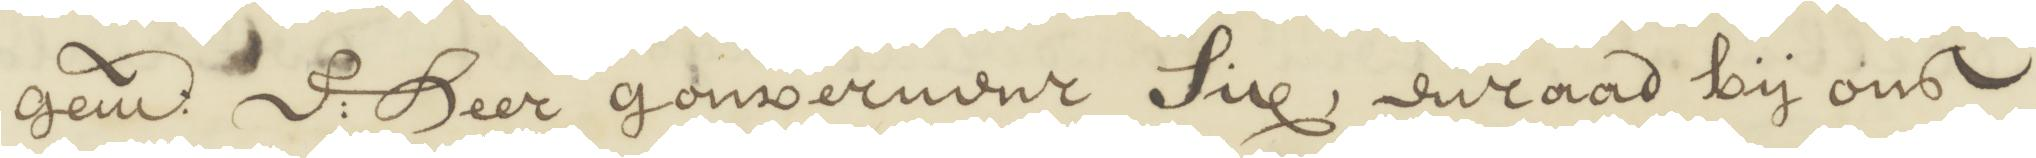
gem: E: Heer gouverneur Six, enraad bij ons
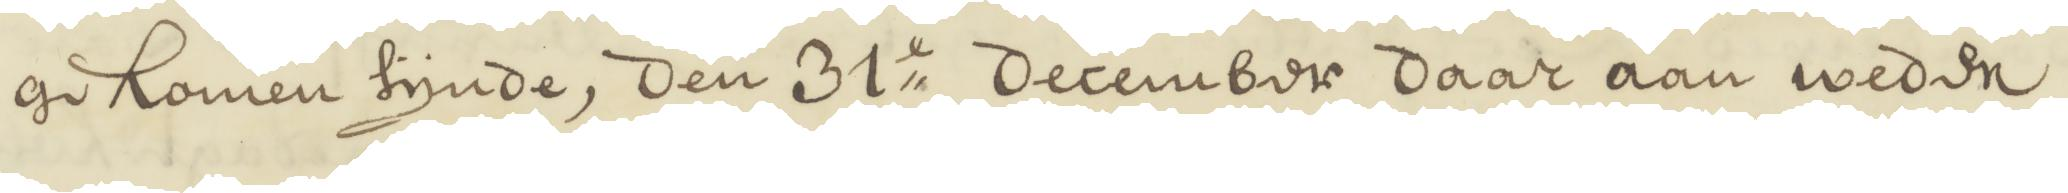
gekomen sijnde, den 31„e december daar aan weder
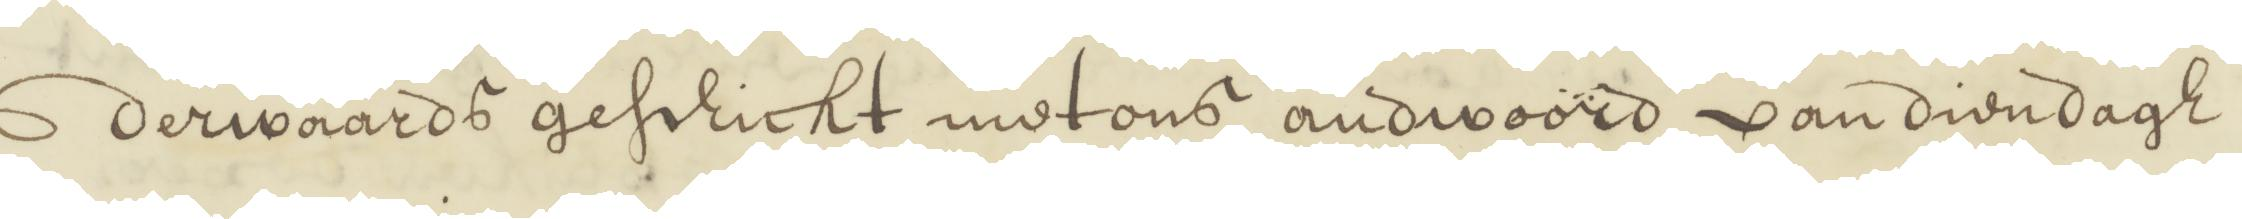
derwaards geschickt met ons andwoord van diendagh
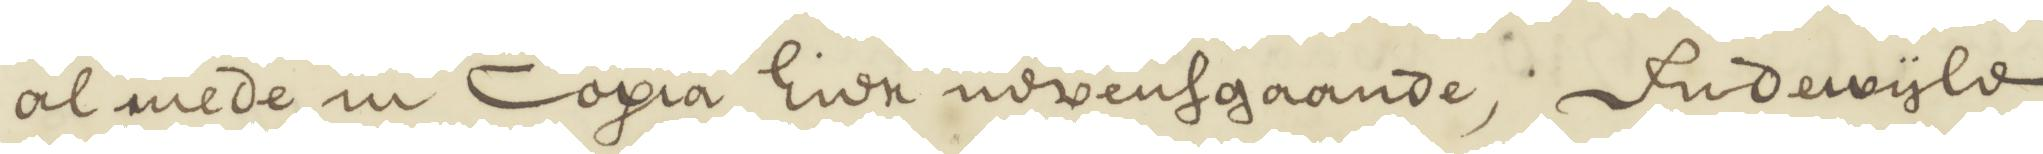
al mede in Copia hier nevensgaande, Endewijle
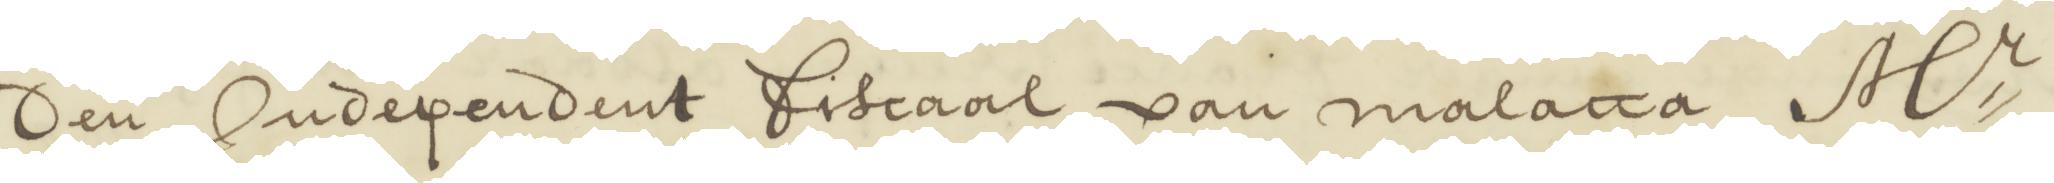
den Jndependent fiscaal van malacca M„r
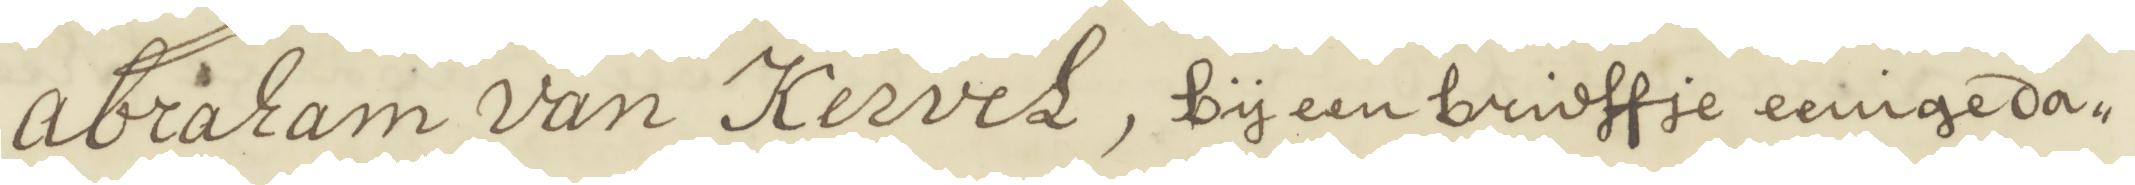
Abraham van Kervel, bij een brieffje eenige da„
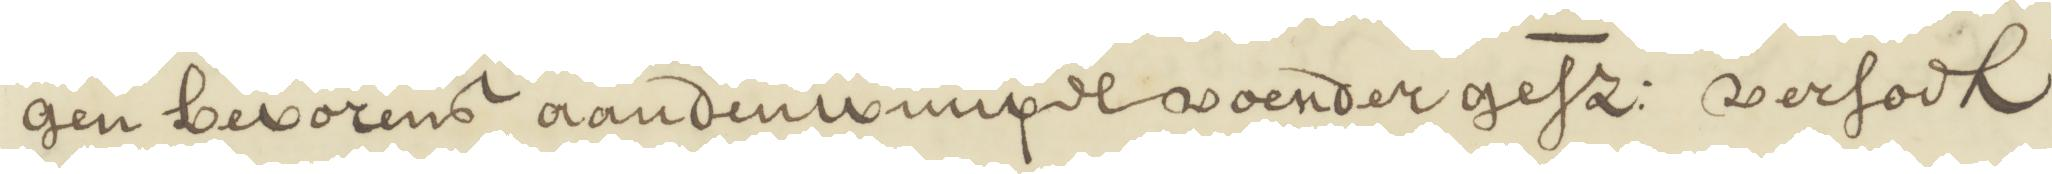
gen bevorens aandenwimpel voerder gesz: versoek
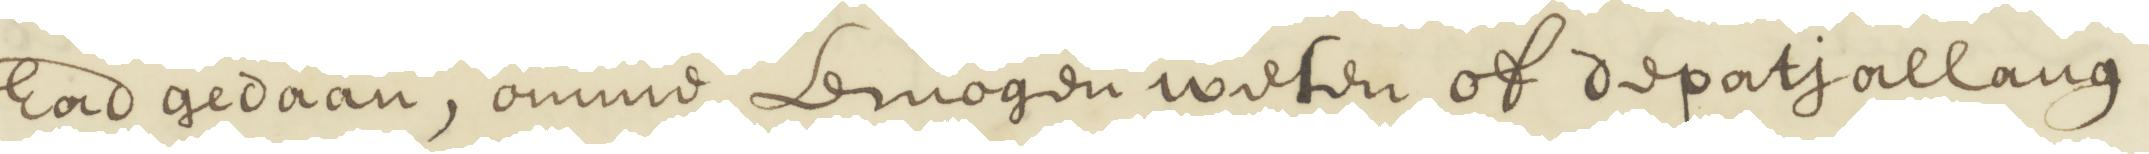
had gedaan, omme temogen weten of depatjallang
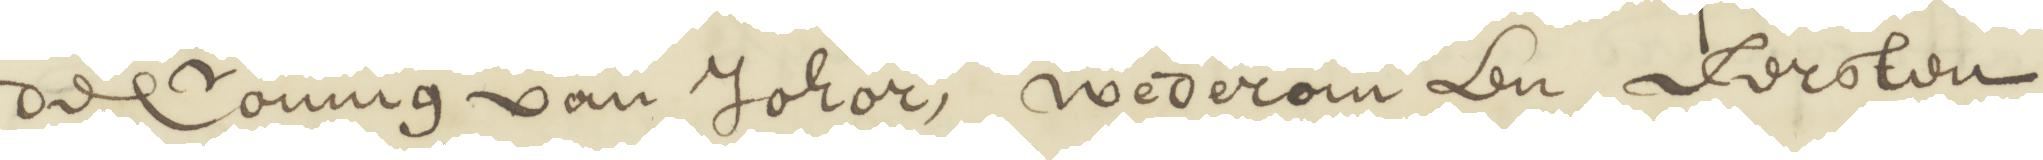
de Coning van Johor, wederom ten Eersten
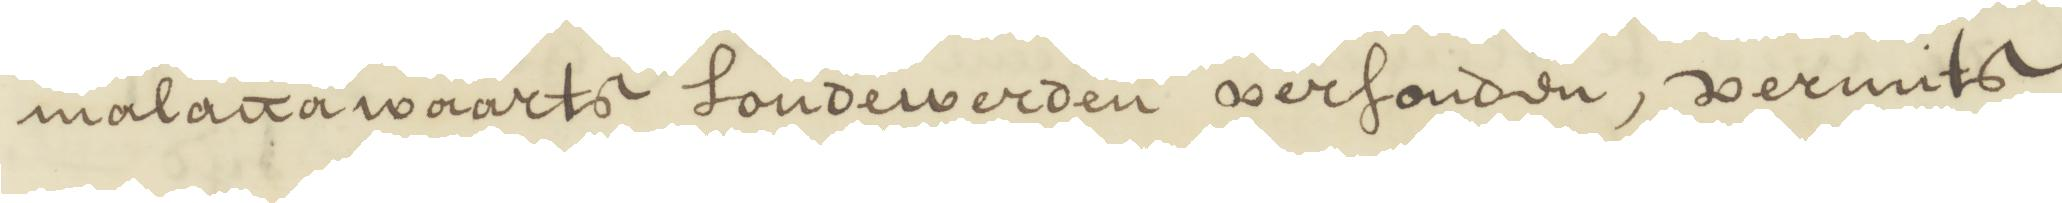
malaccawaarts soudewerden versonden, vermits
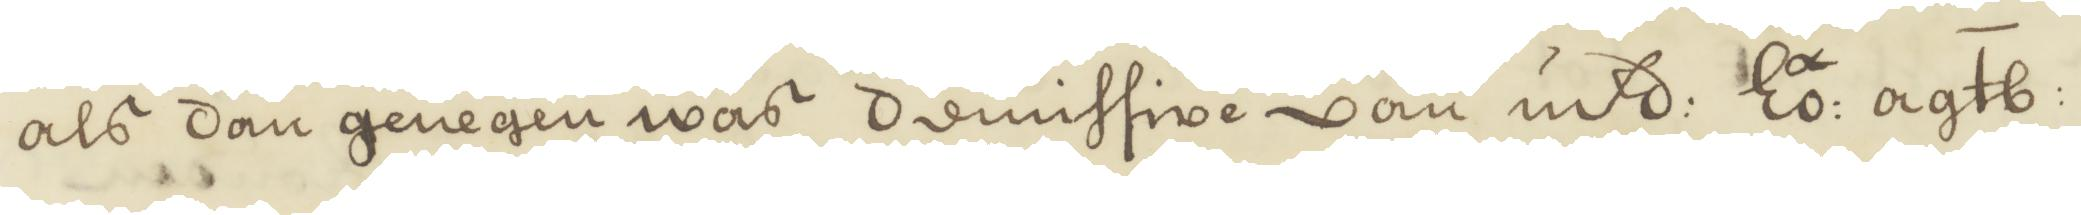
als dan genegen was de missive van u Ed: ho: agtb:
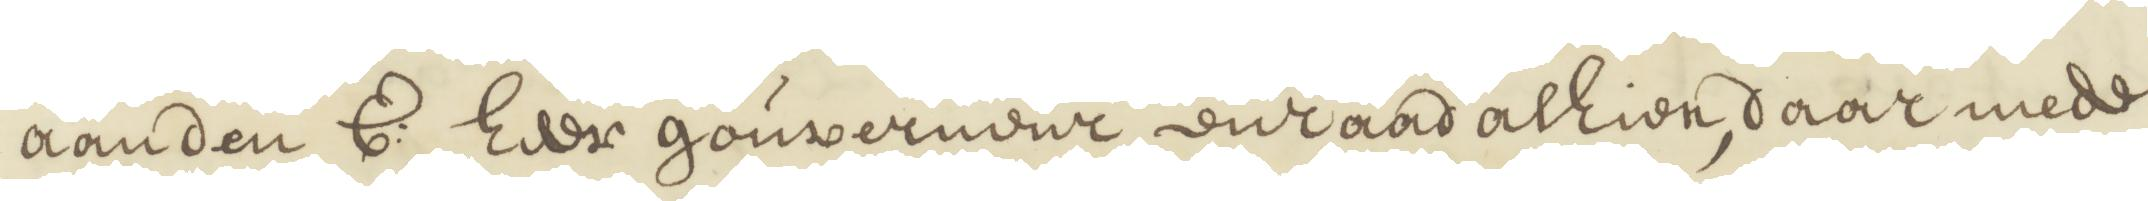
aan den E: heer gouverneur en raad alhier, daar mede
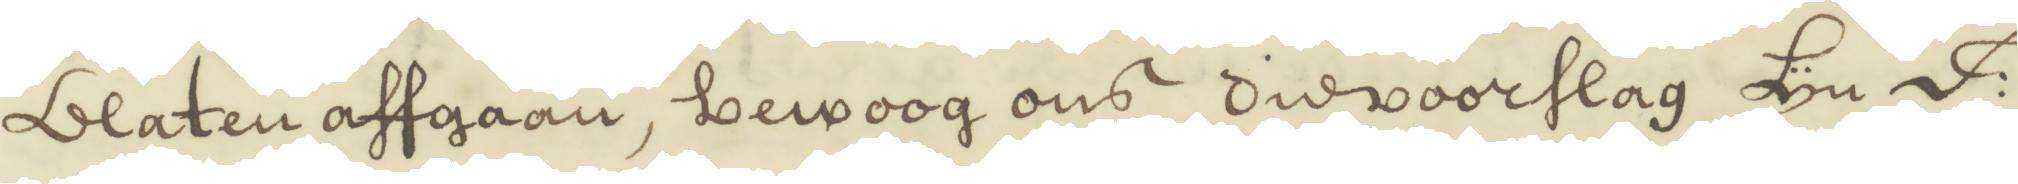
telaten affgaan, bewoog ons die voorslag Sijn E:
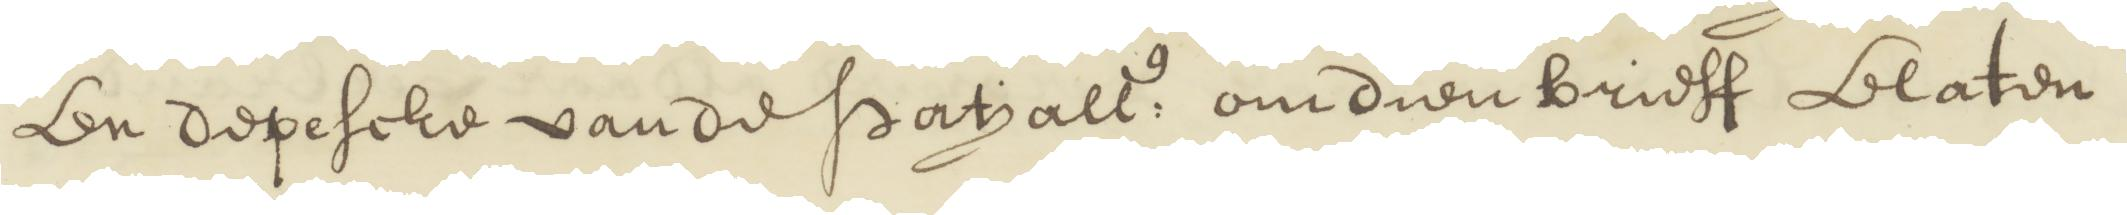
ten depesche van de patjall:g om dien brieff te laten
